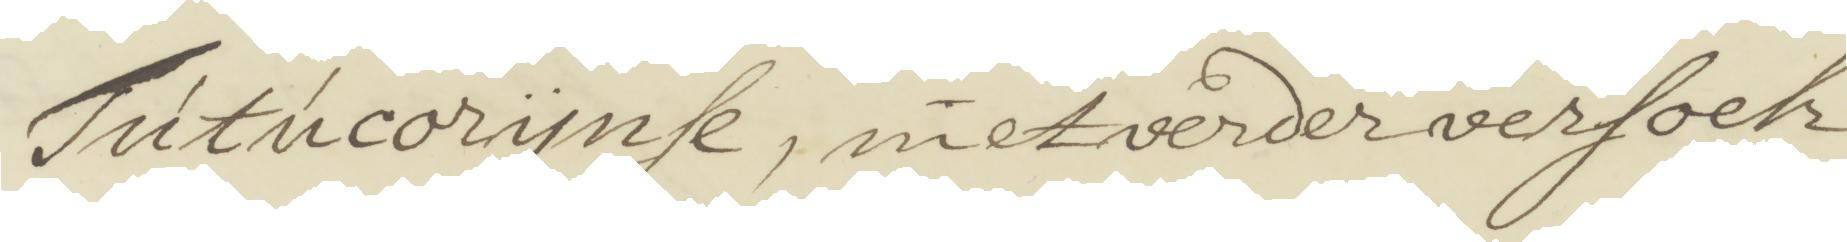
tutucorijnse, met verder versoek
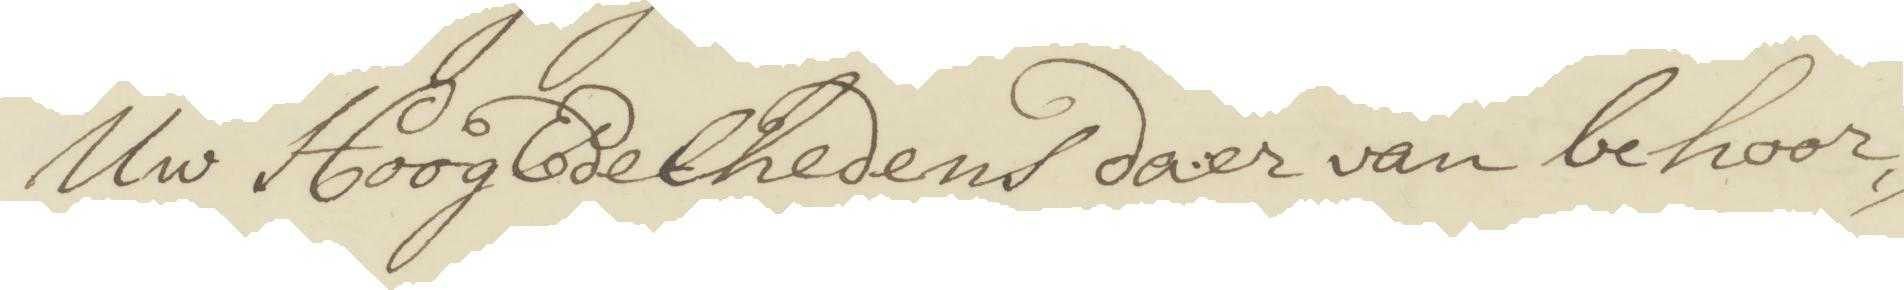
Uw Hoog Edelhedens daer van behoor„
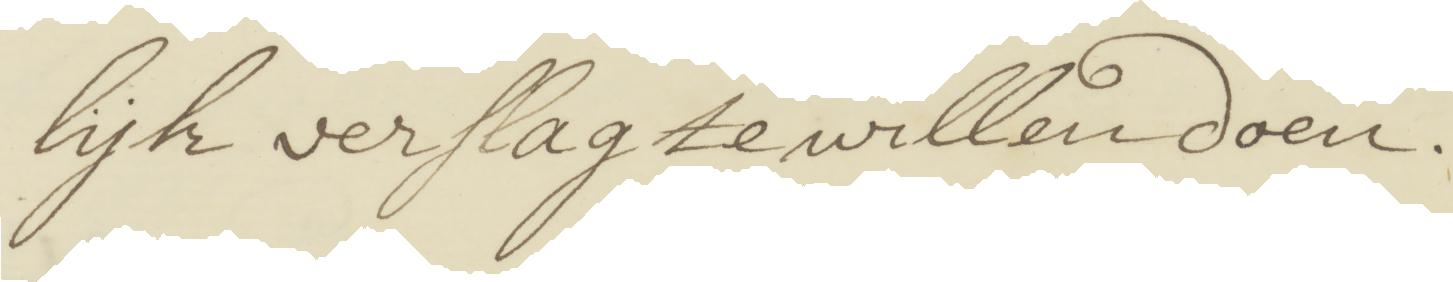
lijk verslag te willen doen.
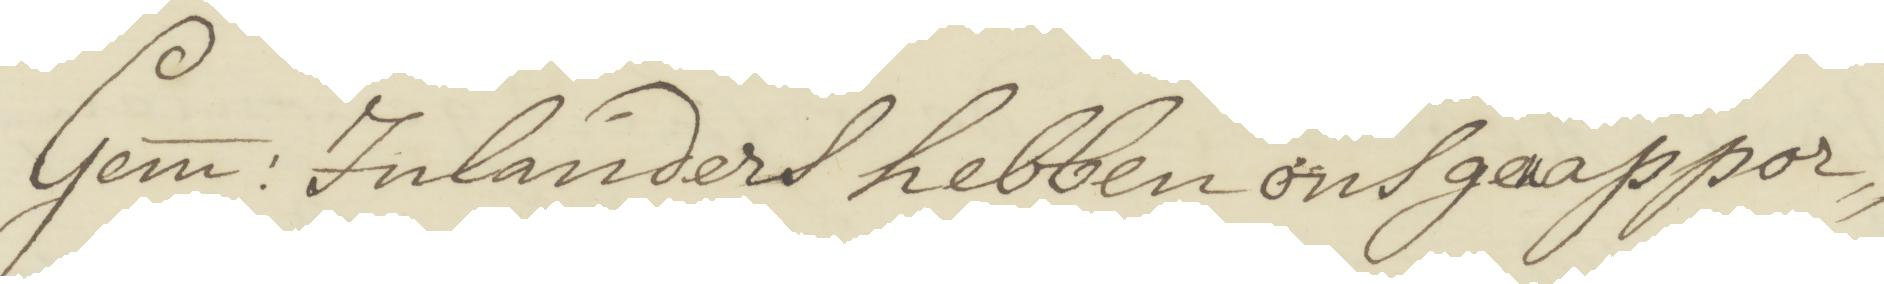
Gem: Inlanders hebben ons gerappor„
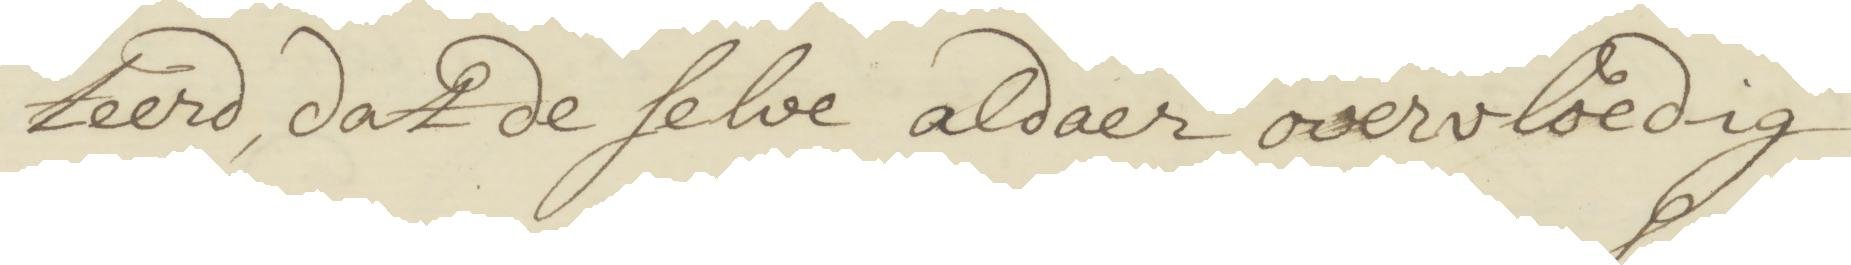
teerd, dat de selve aldaer overvloedig
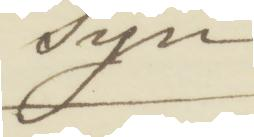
syn
